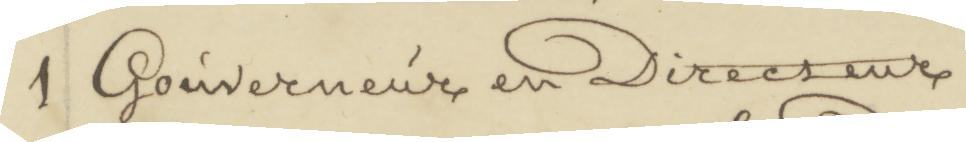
1 Gouverneur en Directeur
